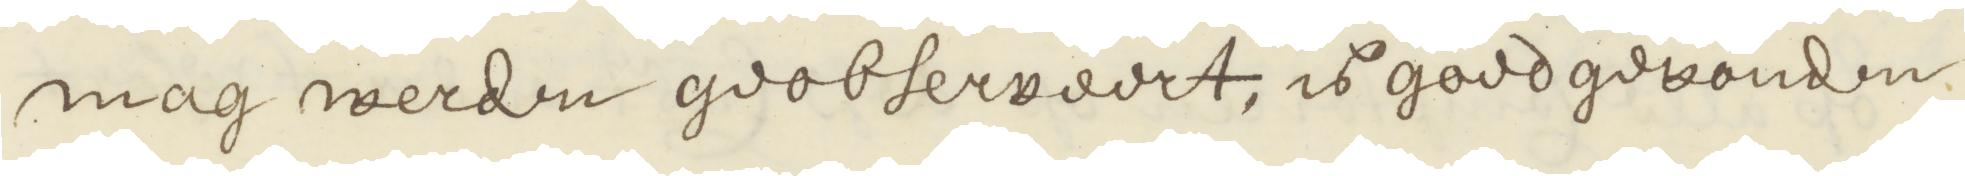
mag werden geobserveert, is goed gevonden
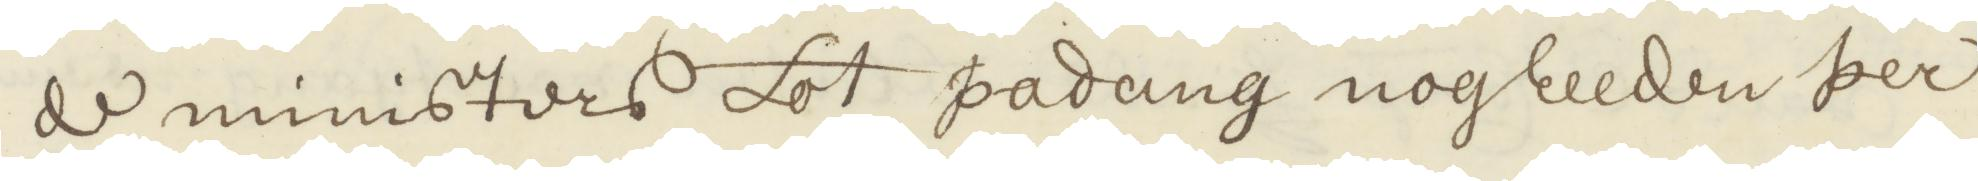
de ministers tot padang nog heeden per
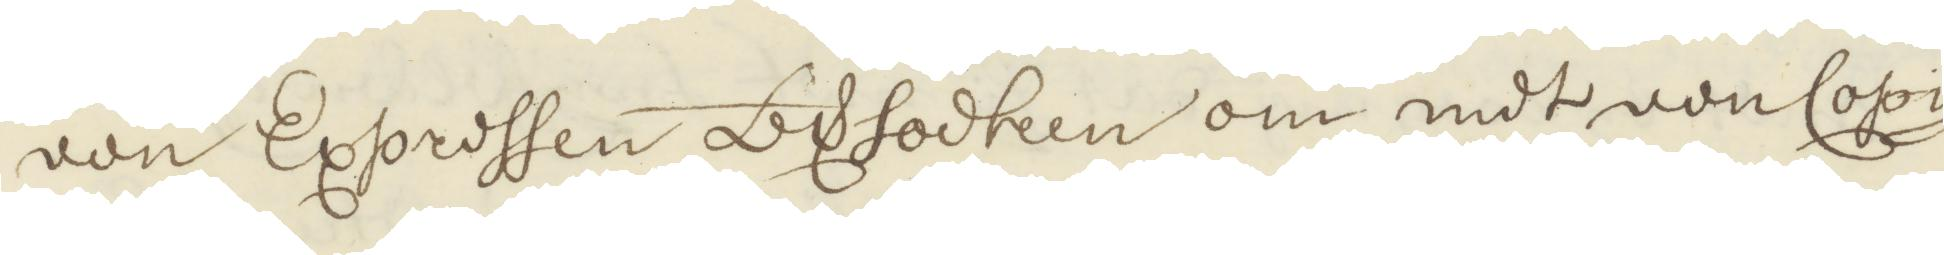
een Expressen teversoeken om met een copij
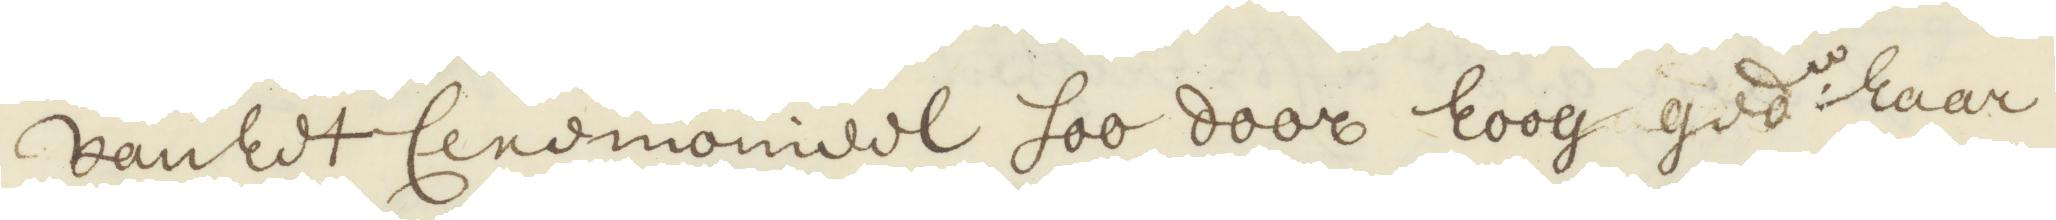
van het ceremonieel soo door hoog ged:e haar
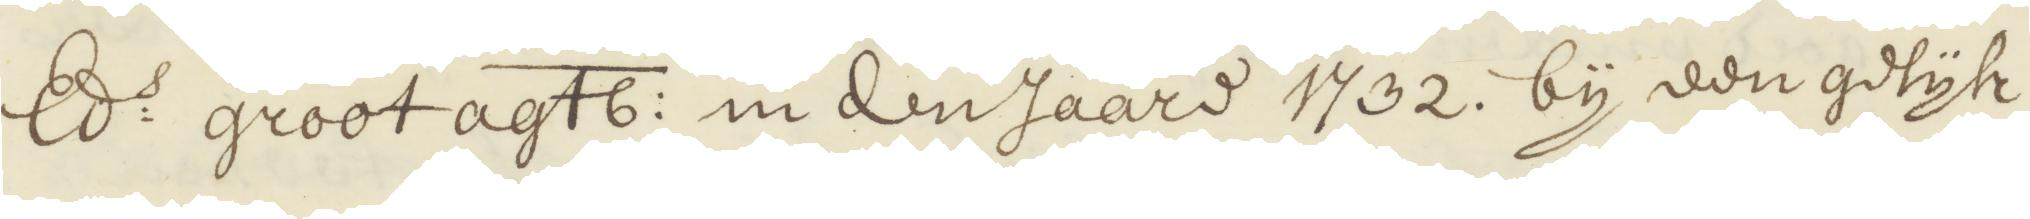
Ed:s groot agtb: in den Jaare 1732. bij een gelijk
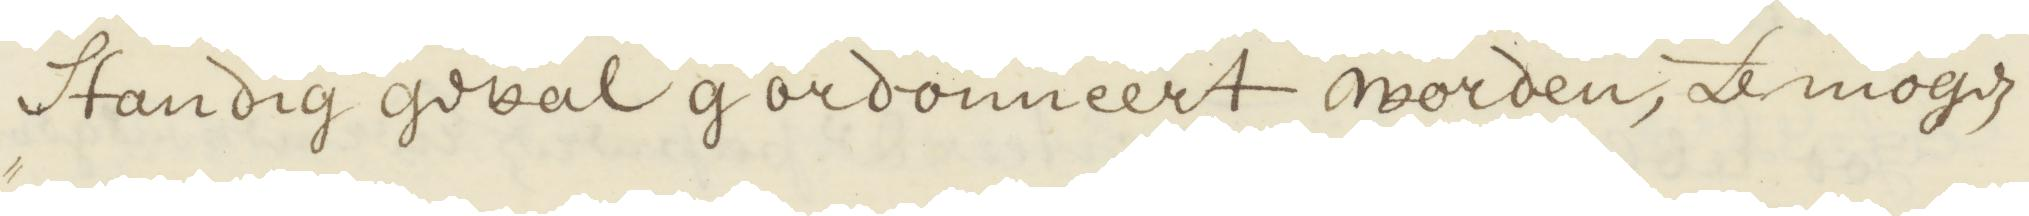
„standig geval g'ordonneert worden, te mogen
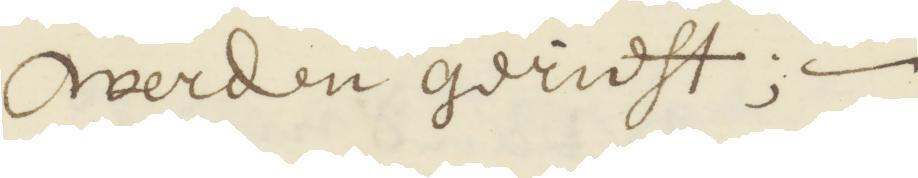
werden gerieft;—.
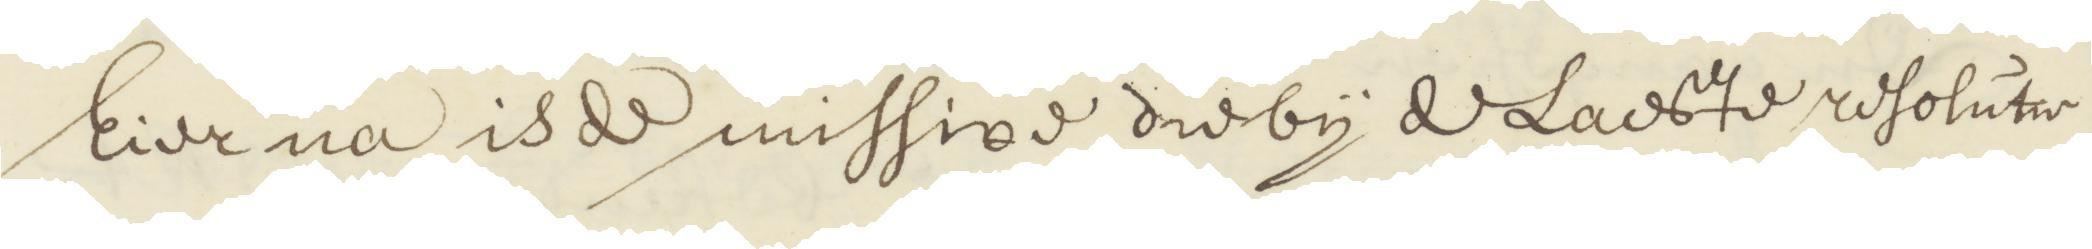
hier na is de missive die bij de laeste resolutie
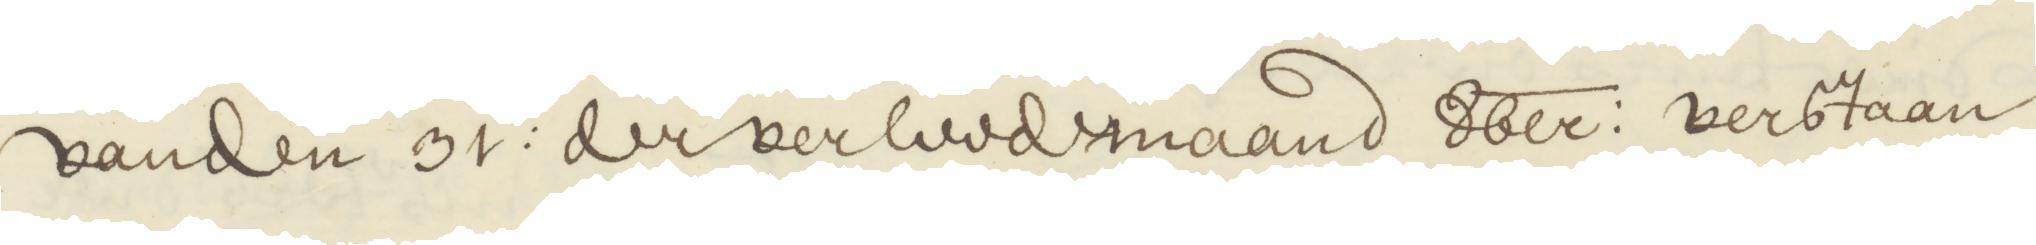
van den 31': der verleede maand 8ber: verstaan
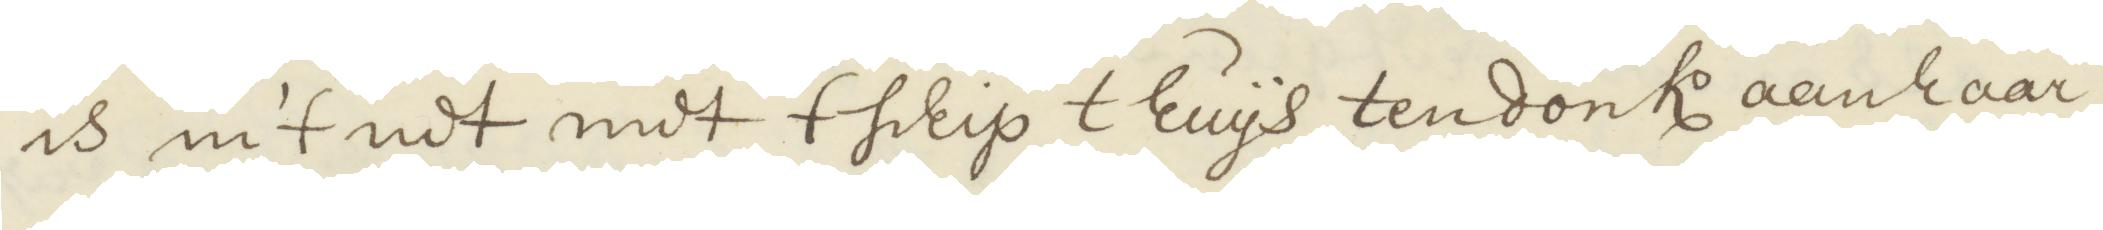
is in ’t net met 't schip ’t huijs ten donk aan haar
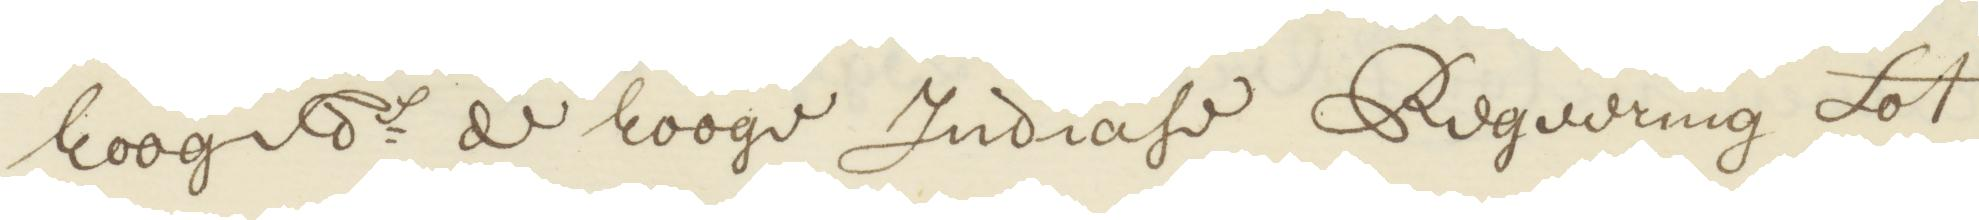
hoog Ed=s de hooge Indiase Regeering tot
